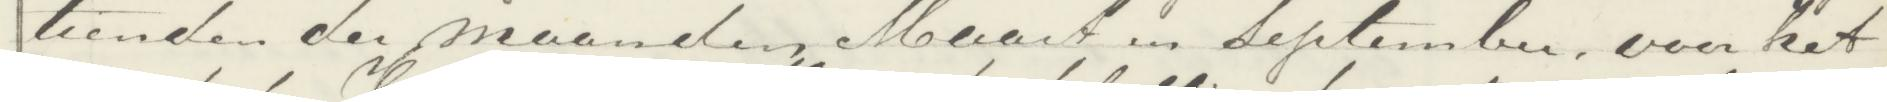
tienden der maanden Maart en September, voor het
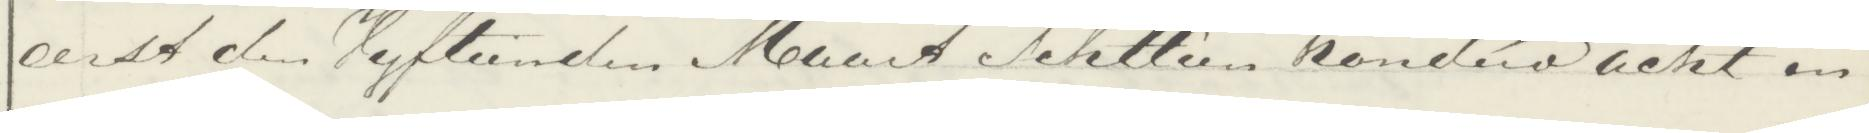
eerst den Vyftienden Maart Achttien honderd acht en
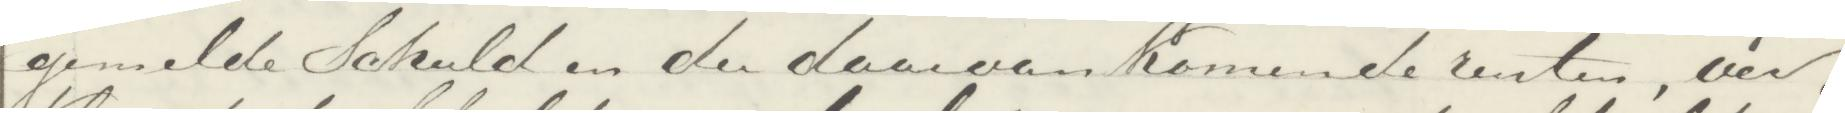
gemelde schuld en der daarvan komende renten, ver
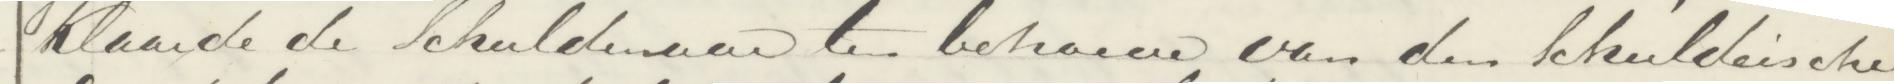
klaarde de schuldenaar ten behoeve van den schuldeische
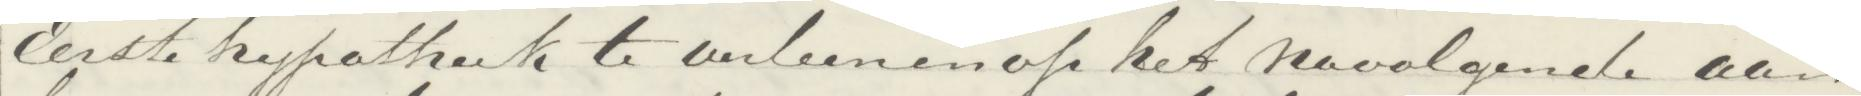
Eerste hypotheek te verleenen op het navolgende aan
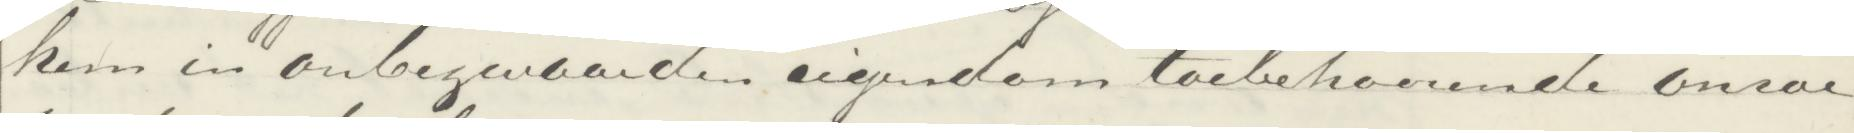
hem in onbezwaarden eigendom toebehoorende onroe
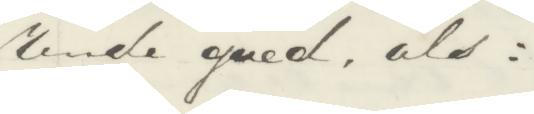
rende goed, als:
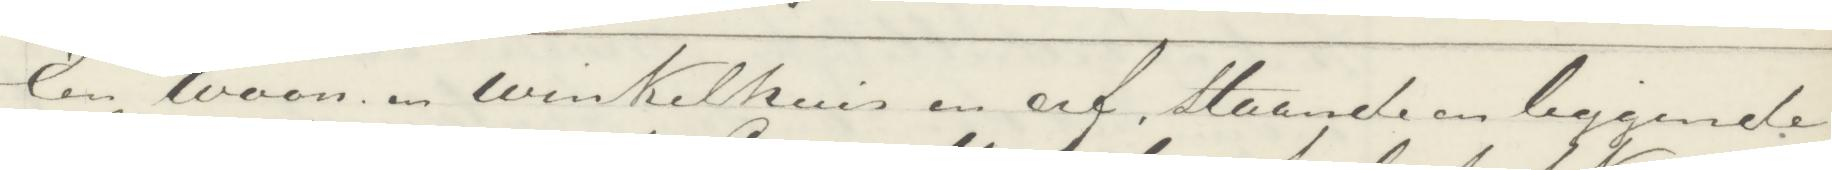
Een woon. en winkelhuis en erf, staande en liggende
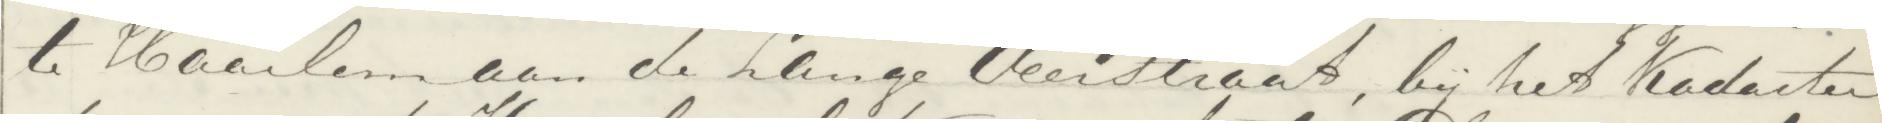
te Haarlem aan de Lange Veerstraat, bij het kadaster
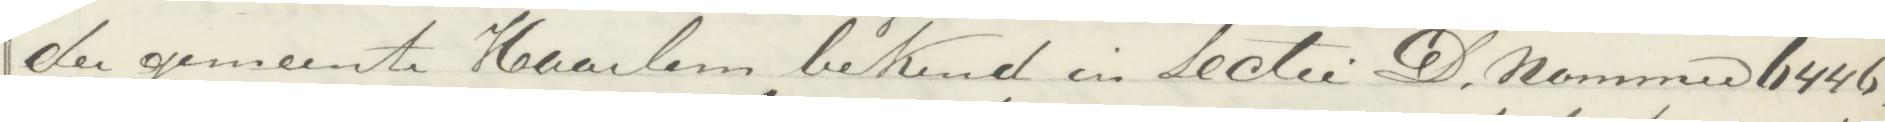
der gemeente Haarlem bekend in sectie D, Nommer 6446
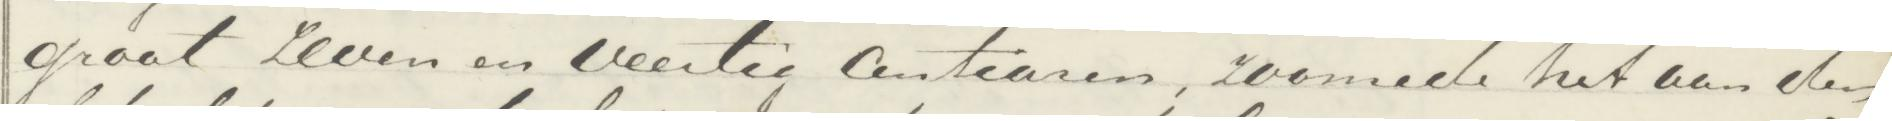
groot zeven en veertig centiaren, zoomede het aan den
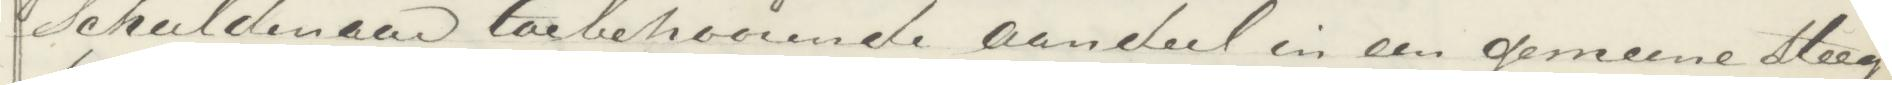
schuldenaar toebehoorende aandeel in een gemeene steeg
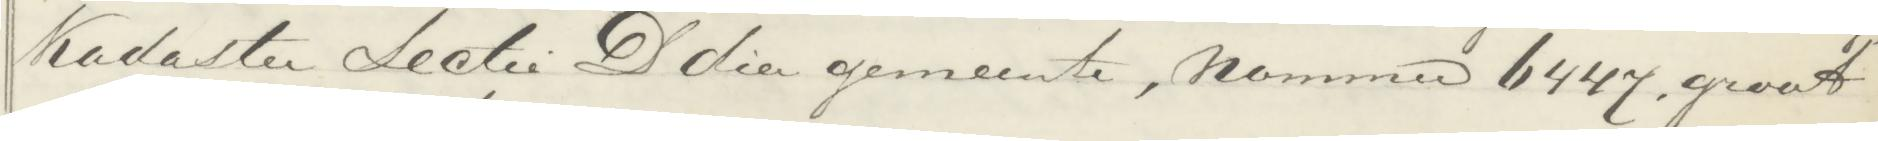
kadaster Sectie D dier gemeente, Nommer 6447, groot
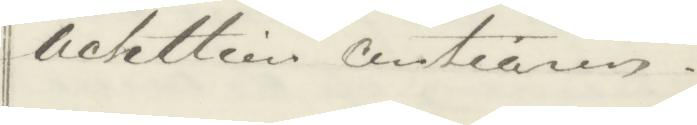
achttien centiaren.
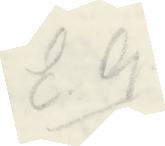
E G
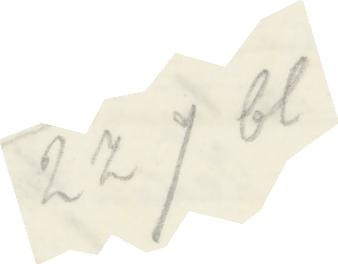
2 Z 7 bl
